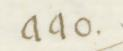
440:
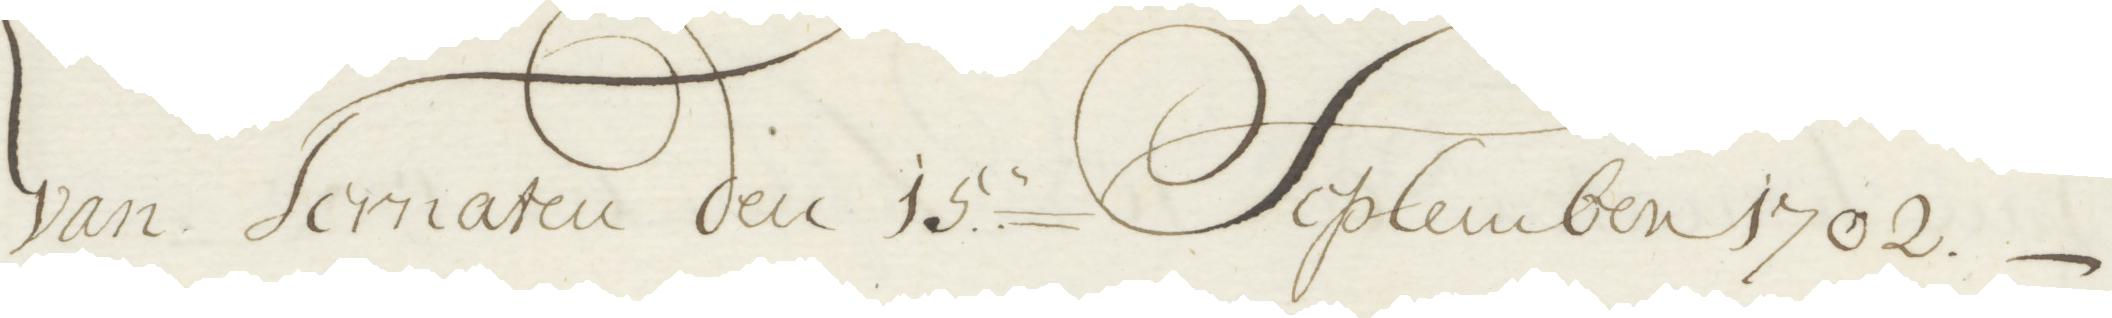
Van Ternaten den 15=' September 1702. —
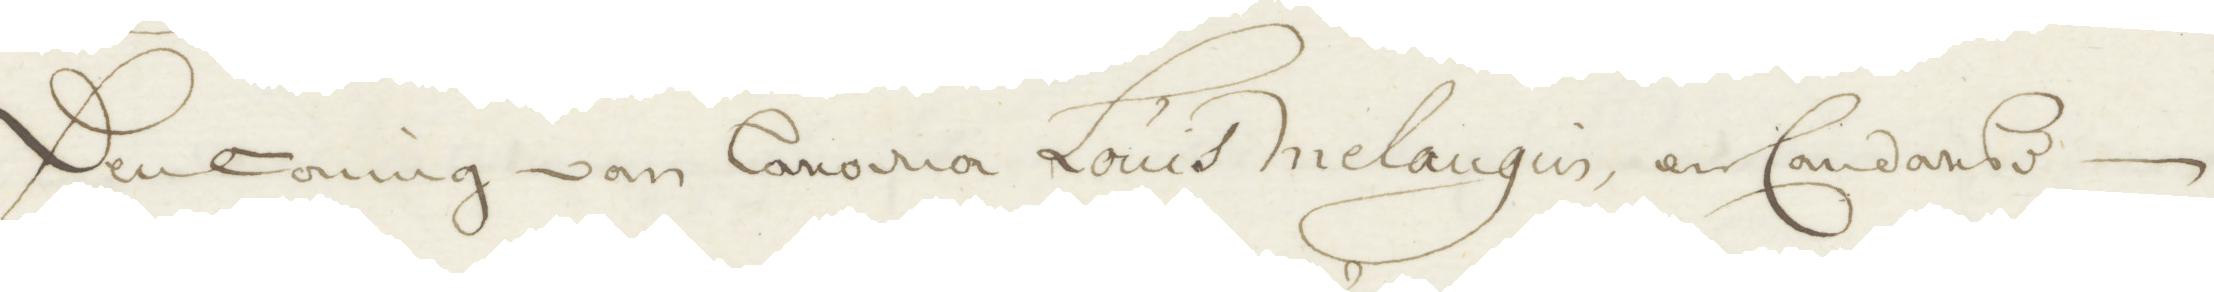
Den coning van Taroena Louis melangin, en Candarse —
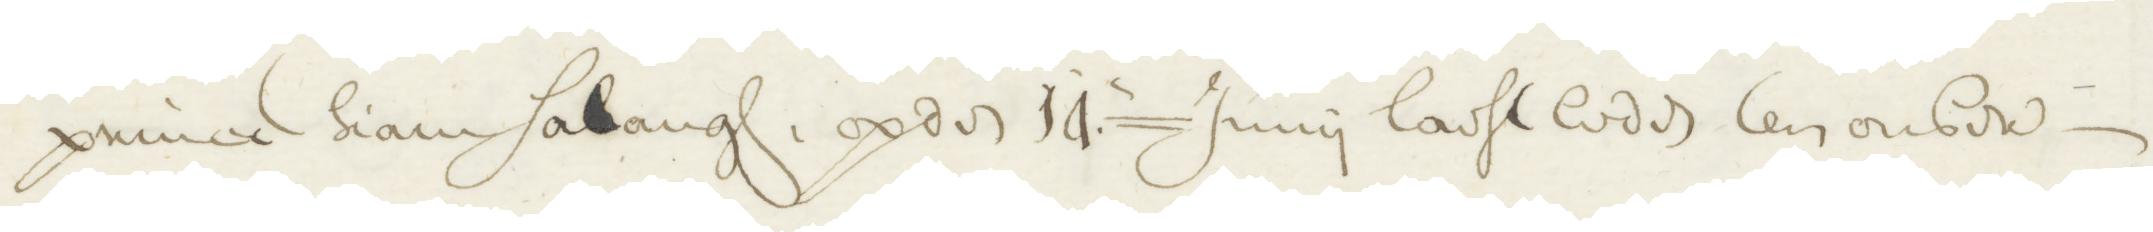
prince siam salangh. op den 14.=en Junij laest leden ten onser —
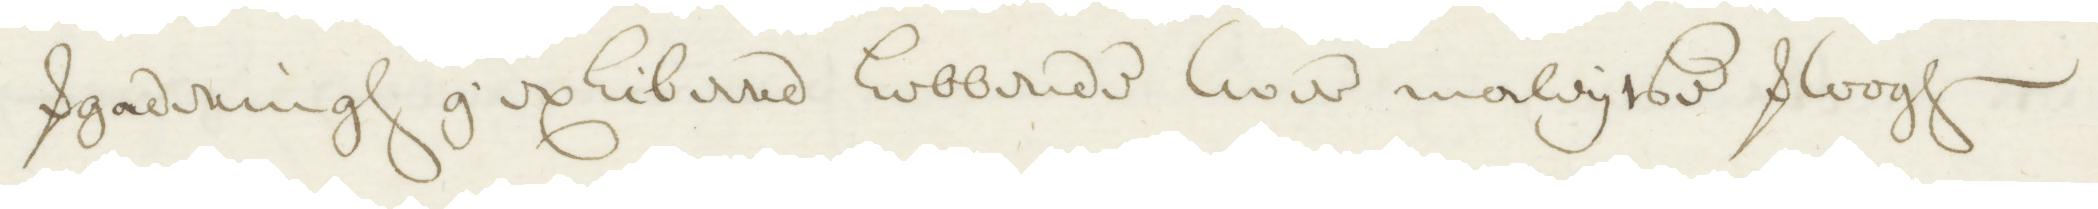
vergaderingh g’exhibeerd hebbende twee maleijtse vertoogh
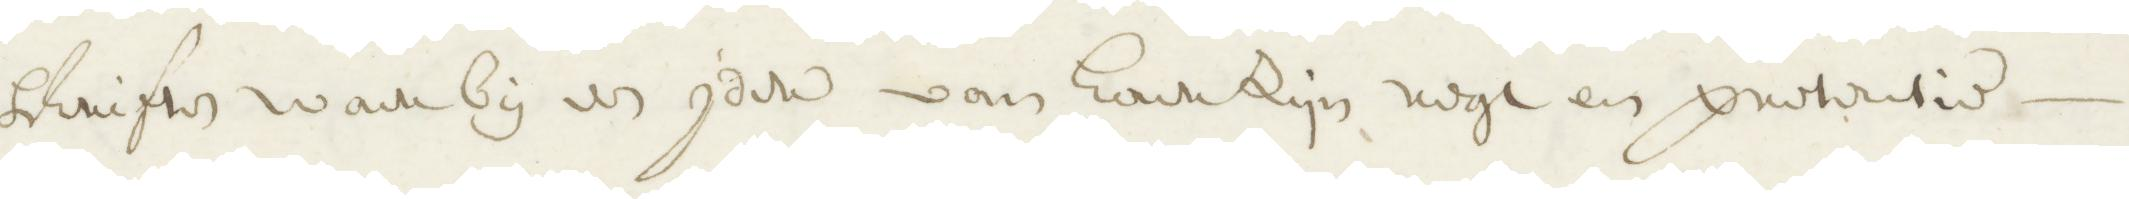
schriften waer bij een jder van haer zijn regt en pretentie —
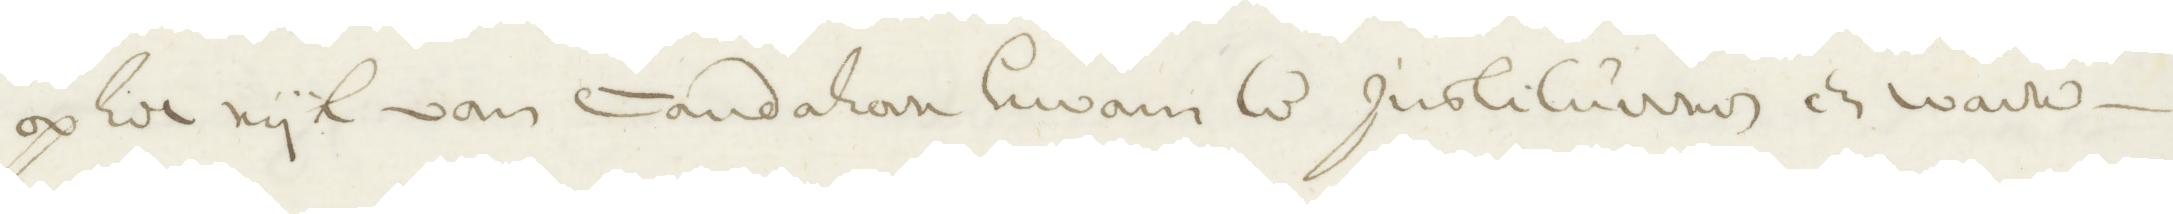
op het rijk van Candahar kwam te jnstitueeren en waer —
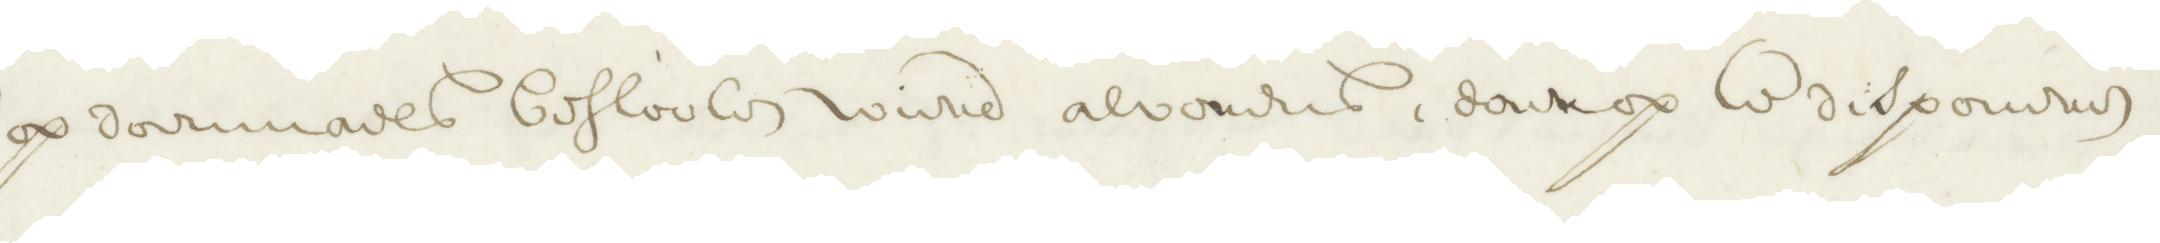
op doenmaels beslooten wierd alvorens, daer op te disponeren
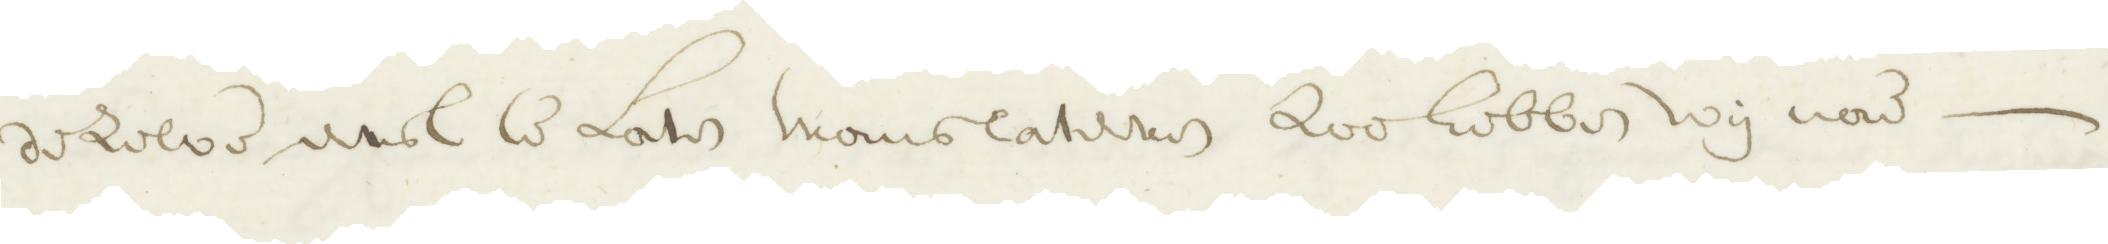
dezelve eerst te laten translateeren zoo hebben wij nae —
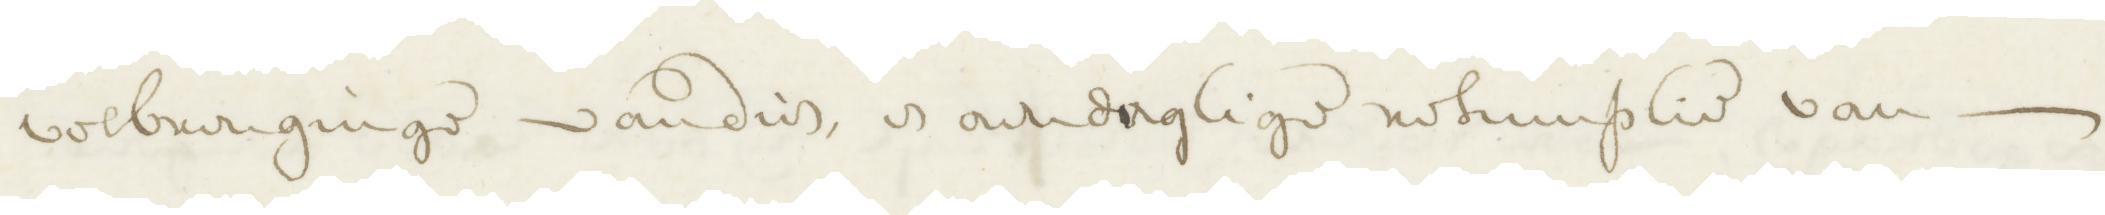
volbrenginge van dien, en aendagtige resumptie van —
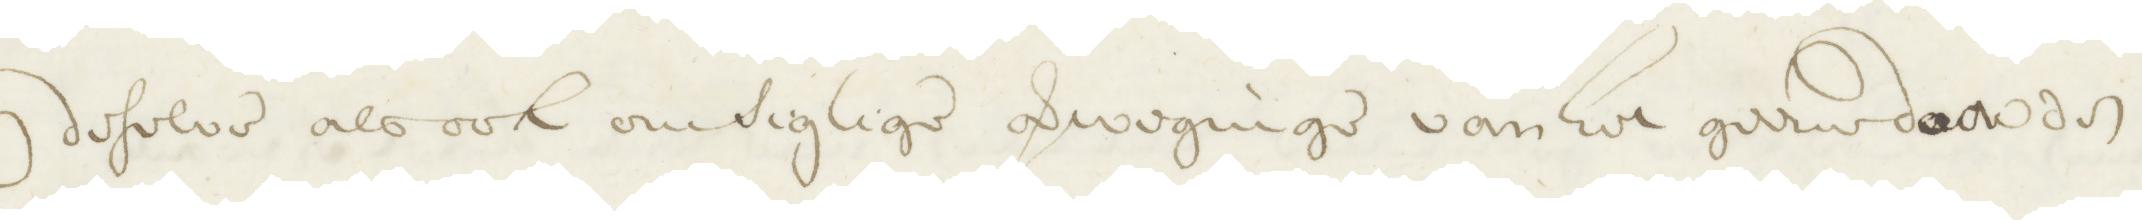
deselve als ook om sigtige overweginge van het geene door den
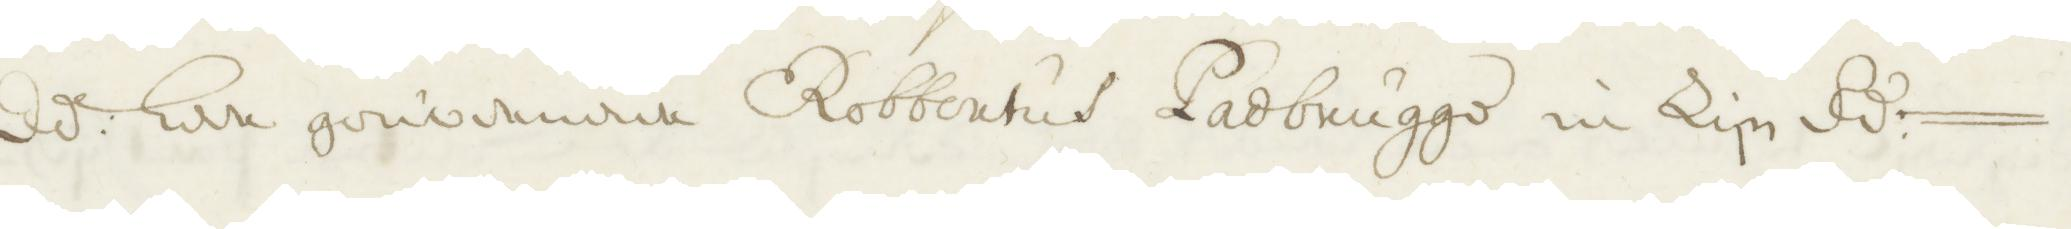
Ed: heer gouverneur Robbertus Padbrugge in zijn Ed:=
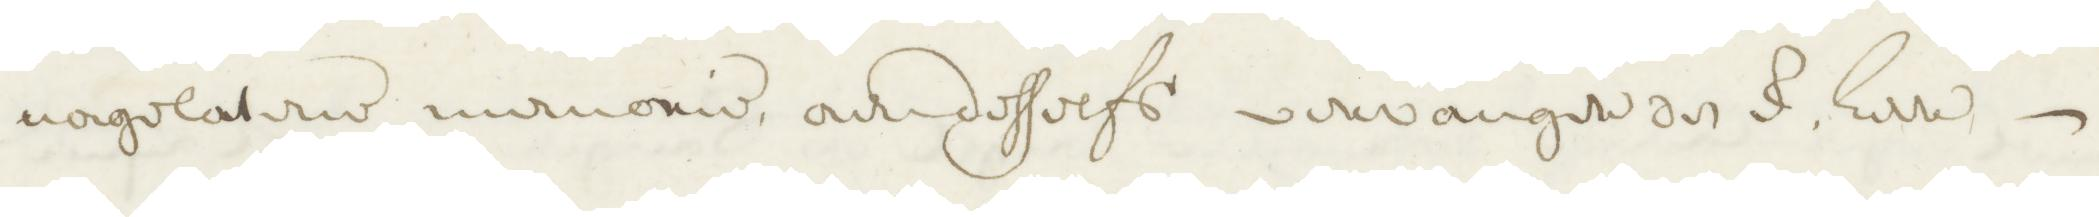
nagelatene memorie, aen desselfs vervanger den E. heer —
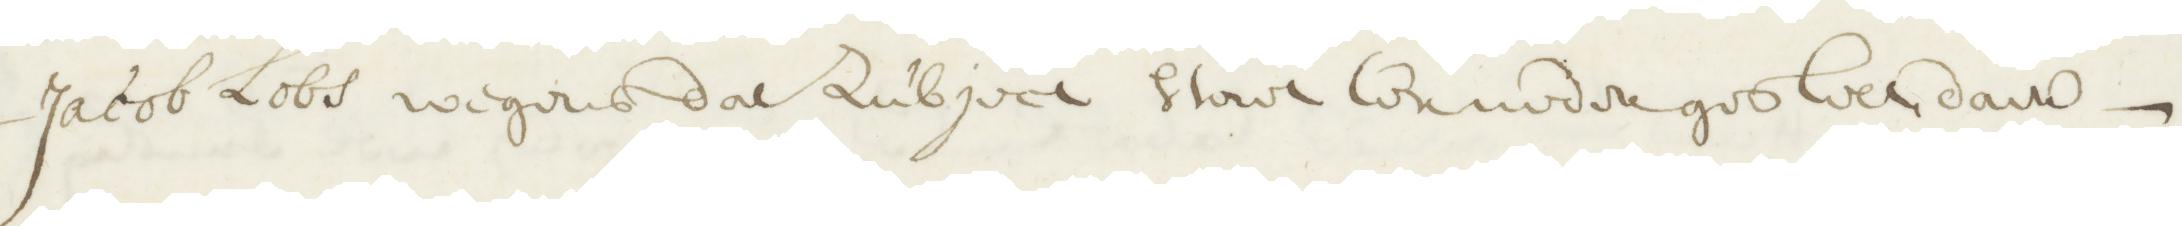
Jacob Lobs wegens dat zubject staet ter neder gestelt daer —
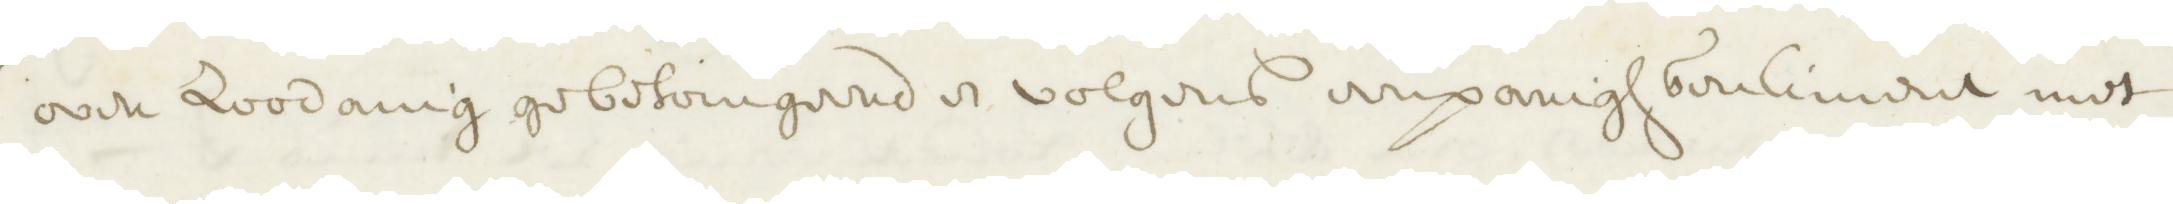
over zoodanig gebesoingeerd en volgens eenparigh sentiment met
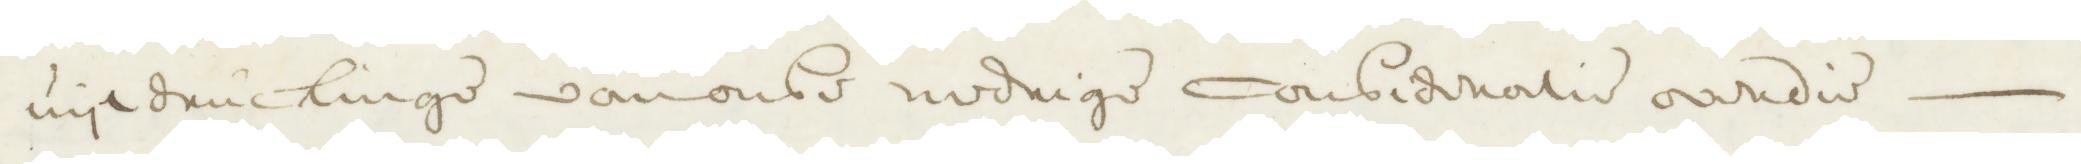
uijt druckinge van onse nedrige consideratie overdie —
